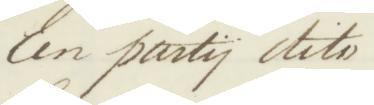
Een partij dito
